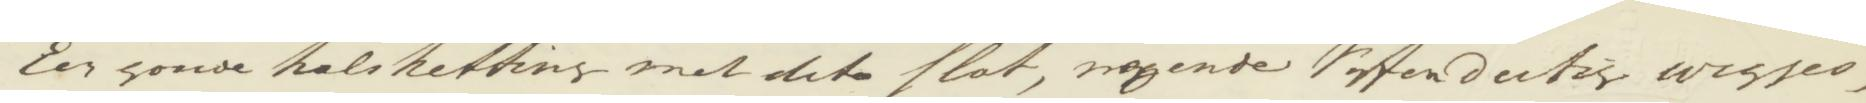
Een goude hals ketting met dito slot, wegende Vyfendertig wigjes,
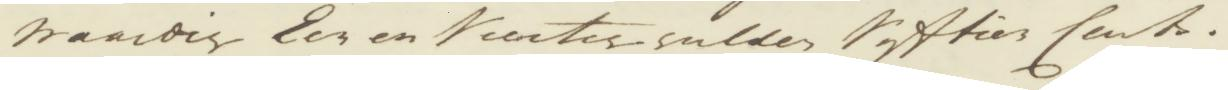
waardig Een en Veertig gulden Vyftien Cents.
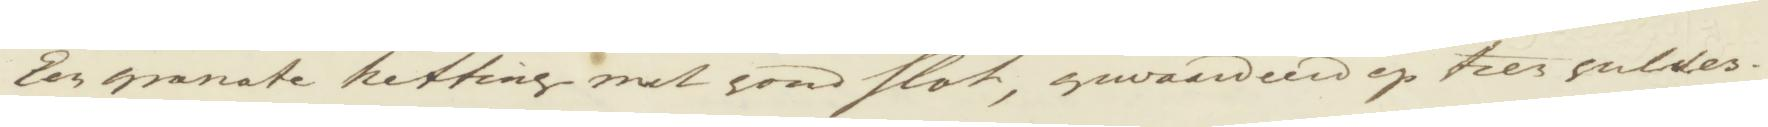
Een granate ketting met goud slot, gewaardeerd op tien gulden.
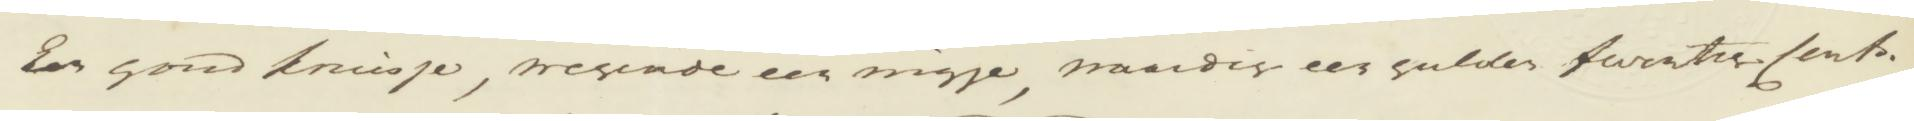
Een goud kruisje, wegende een wigje, waardig een gulden twintig Cents.
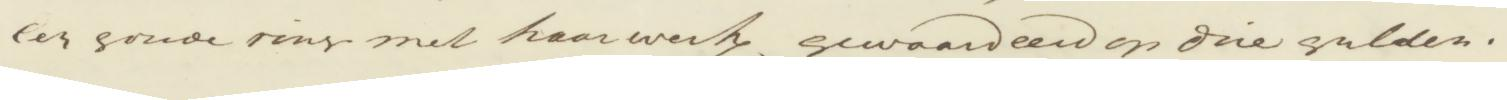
Een goude ring met haarwerk, gewaardeerd op drie gulden.
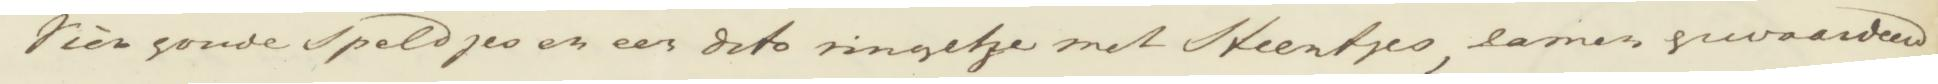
Vier goude speldjes en een dito ringetje met steentjes, zamen gewaardeerd
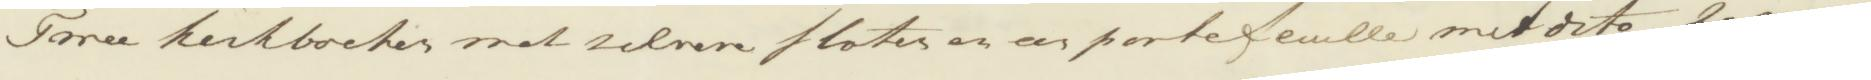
Twee kerkboeken met zilvere sloten en een portefeuille met dito, zamen
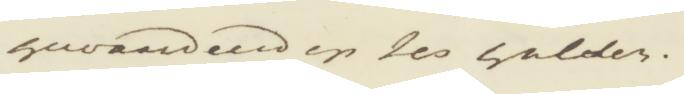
Gewaardeerd op zes gulden.
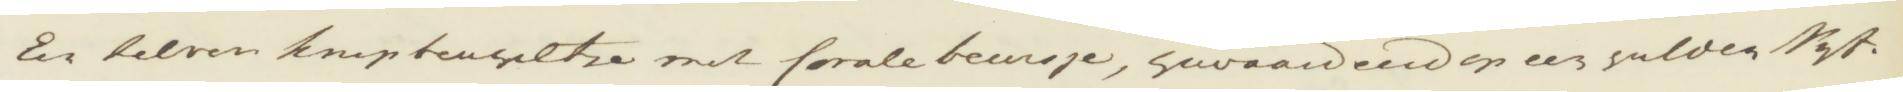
Een zilver kniptengeltje met Corale beursje, gewaardeerd op een gulden Vyf.
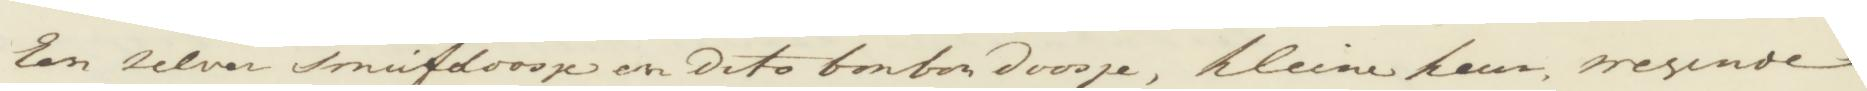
Een zilver snuifdoosje en dito bonbon doosje, kleine keur, wegende
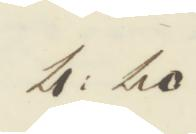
4: 40
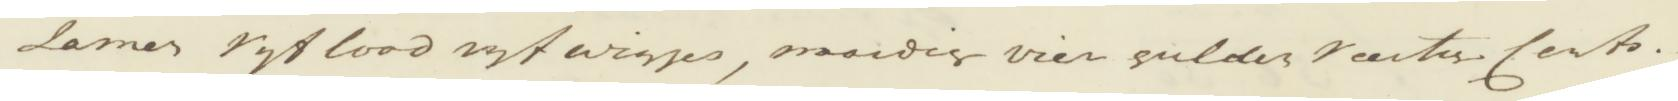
zamen vyf lood vyf wigjes, waardig vier gulden veertig Cents.
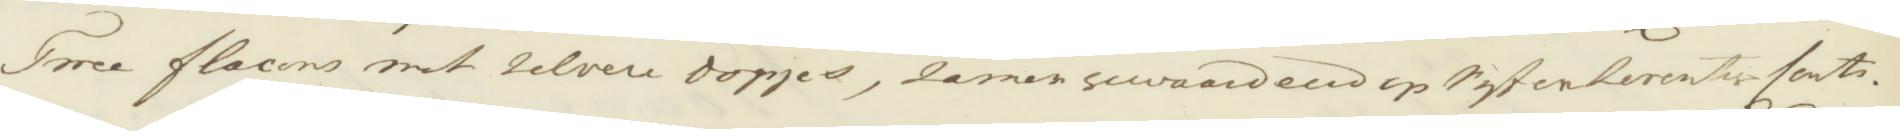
Twee flacons met zilvere dopjes, zamen gewaardeerd op Vyf en zeventig Cents.
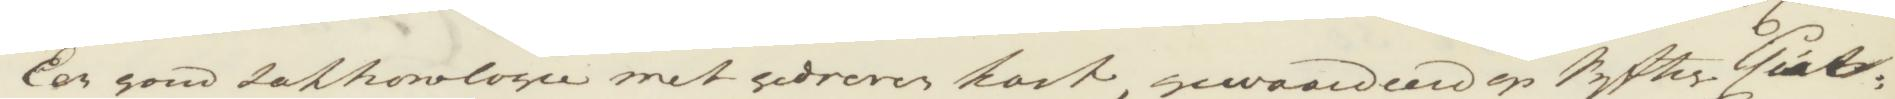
Een goud zakhorologie met gedreven kast, gewaardeerd op Vyftig Gul„
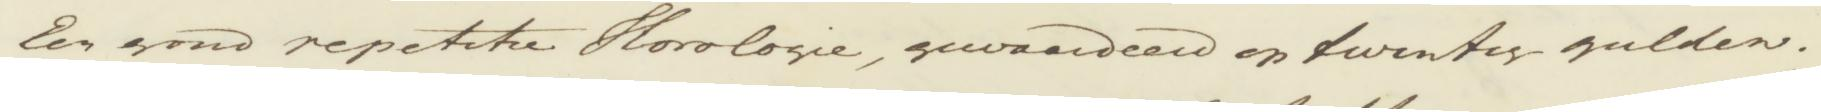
Een goud repetitie Horologie, gewaardeerd op twintig gulden.
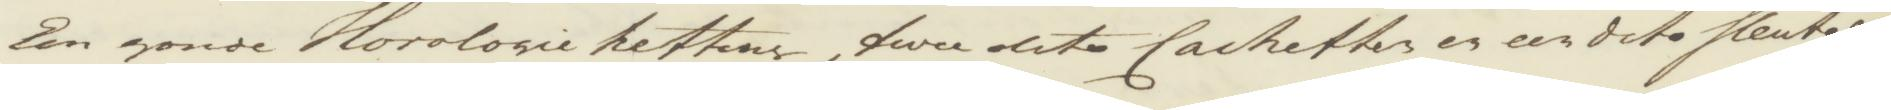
Een goude Horologie ketting, twee dito Cachetten en een dito sleutel
